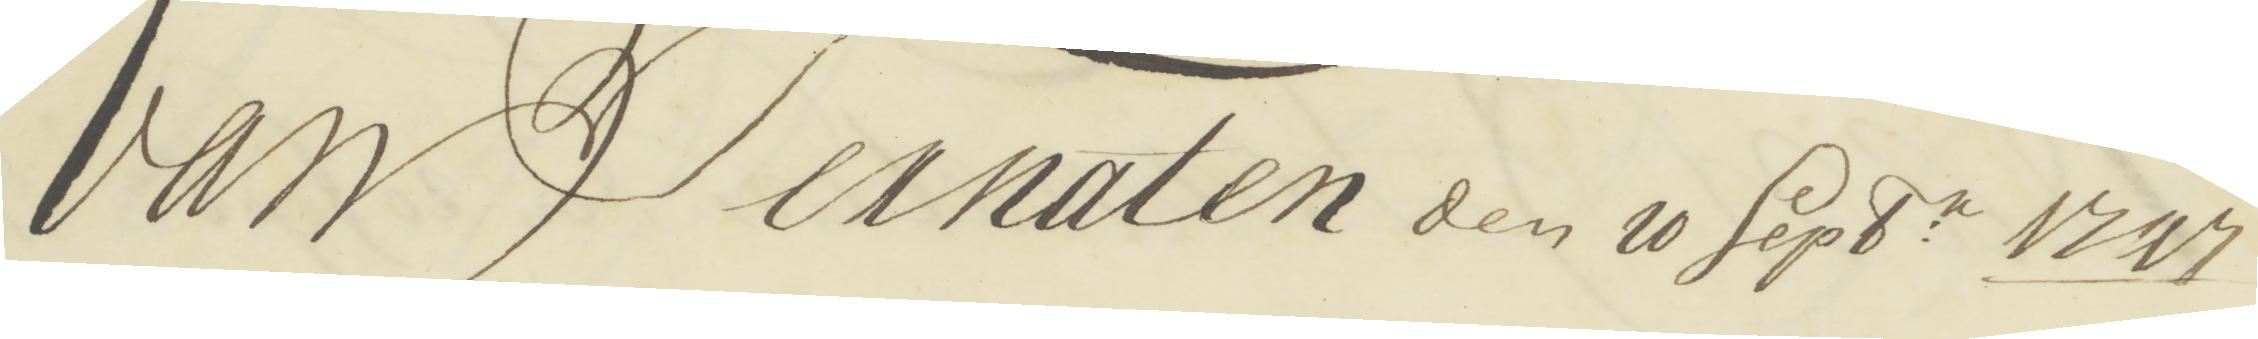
Van Ternaten den 10 Sept:r 1747
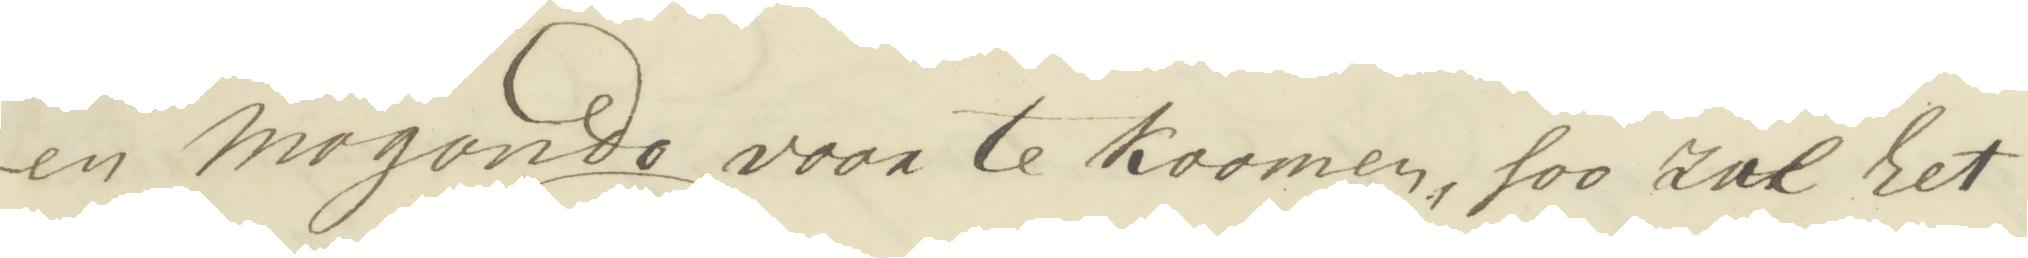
en mogondo voor te koomen, soo zal het
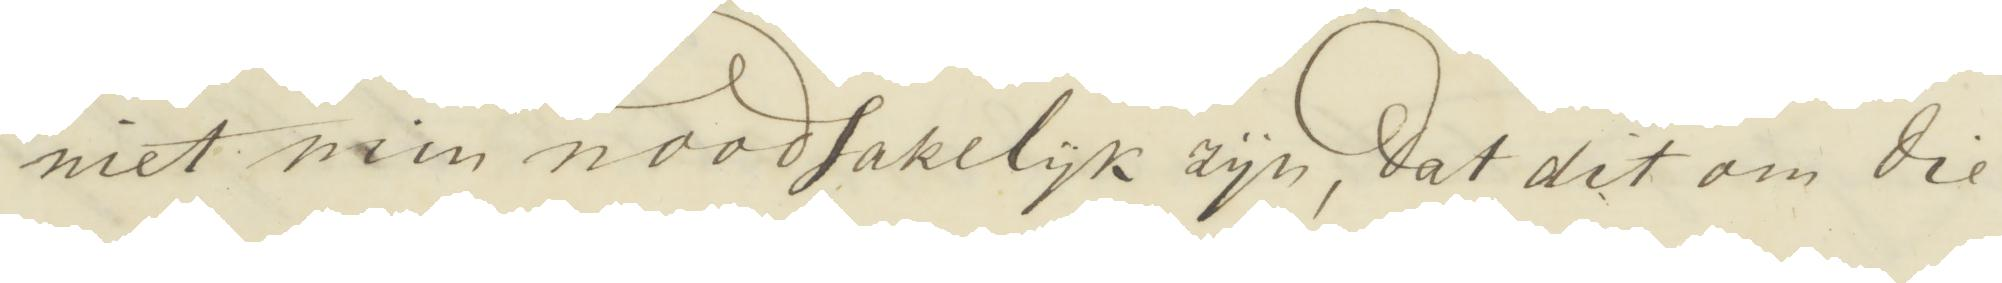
niet min noodsakelijk zijn, dat dit om die
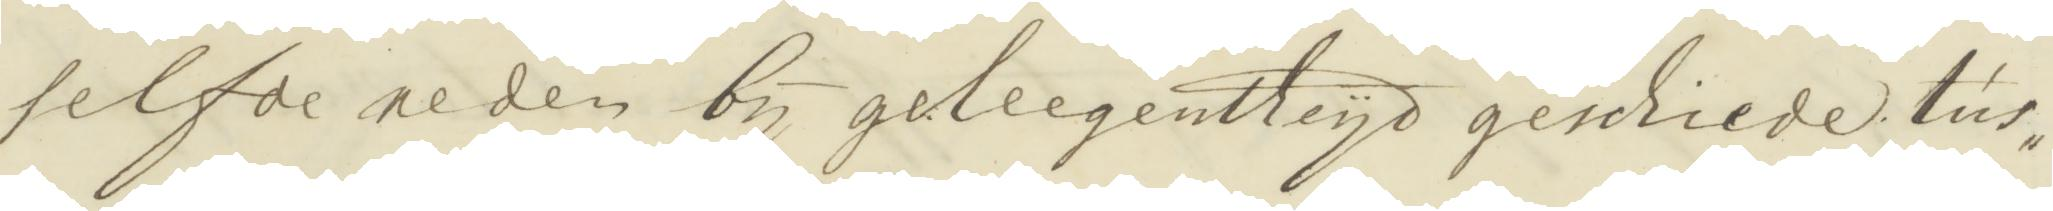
selfde reden bij geleegentheijd geschiede tus„
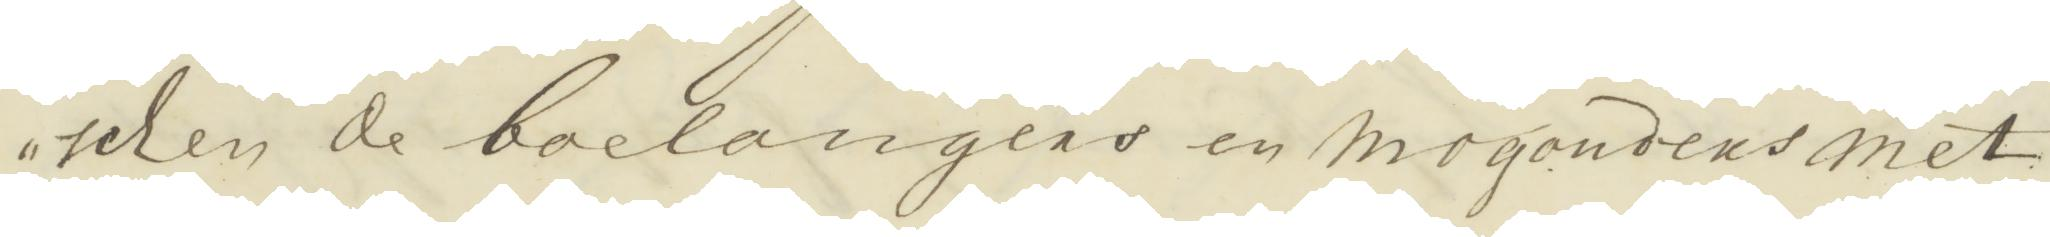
„schen de boelangers en mogonders met
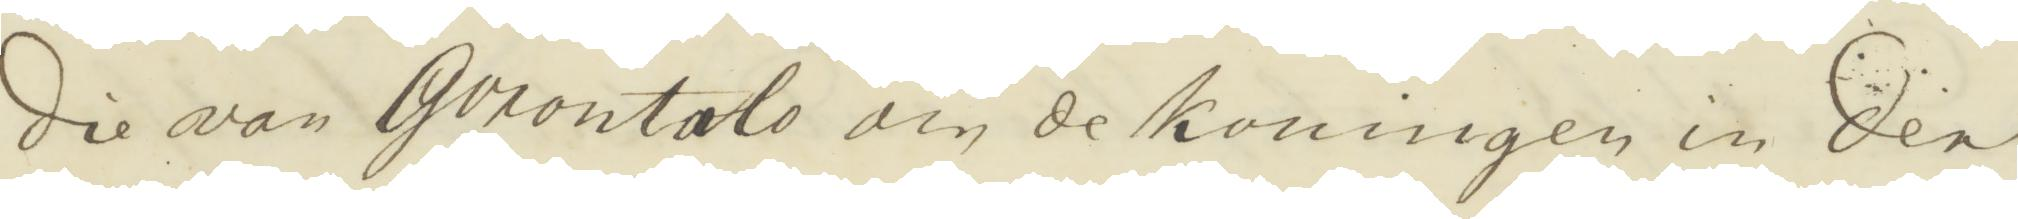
die van Gorontalo om de koningen in der
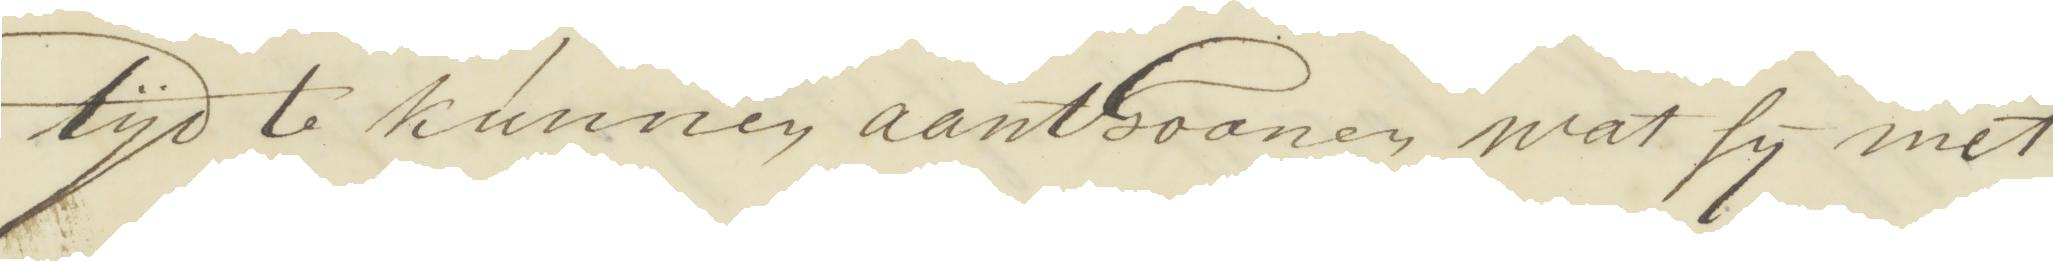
tijd te kunnen aanthoonen wat sij met
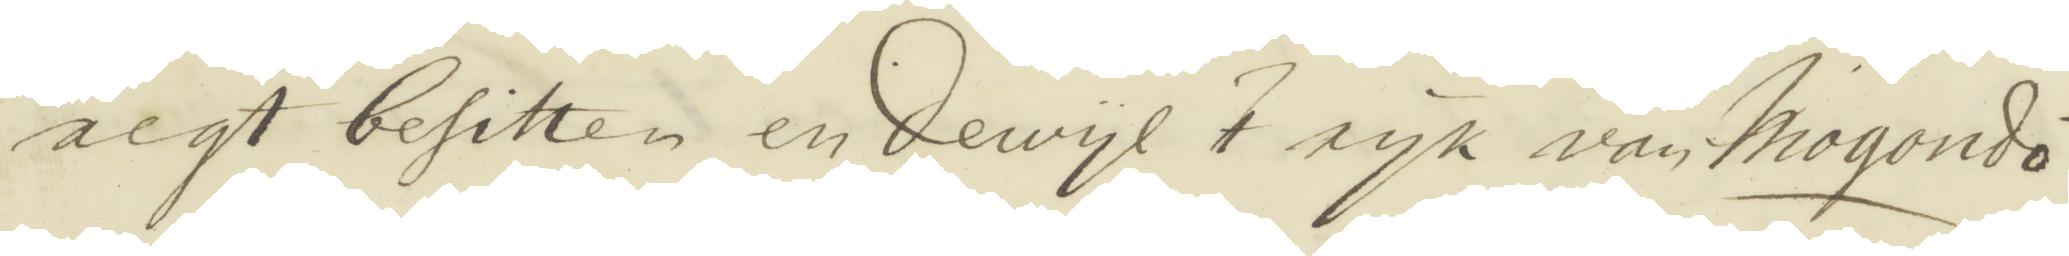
regt besitten en dewijl ’t rijk van mogondo
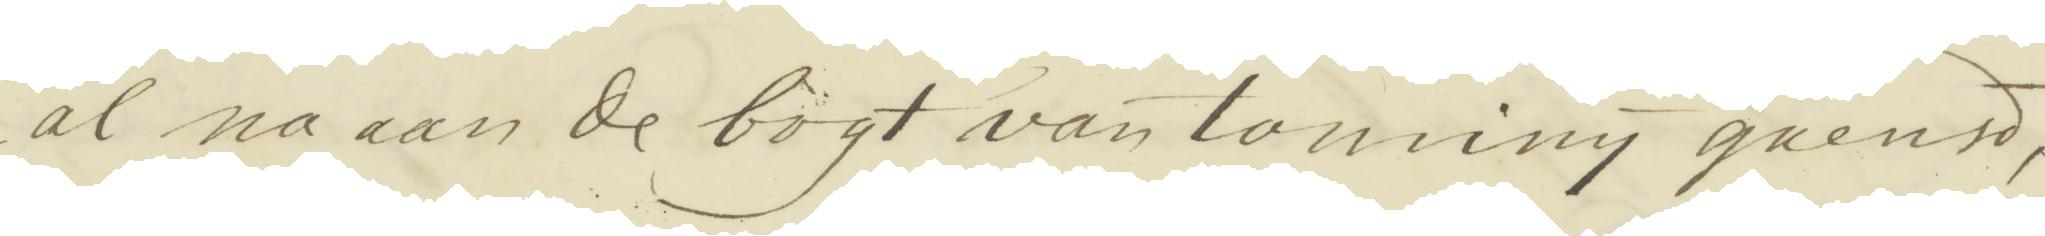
al na aan de bogt van tominij grensd
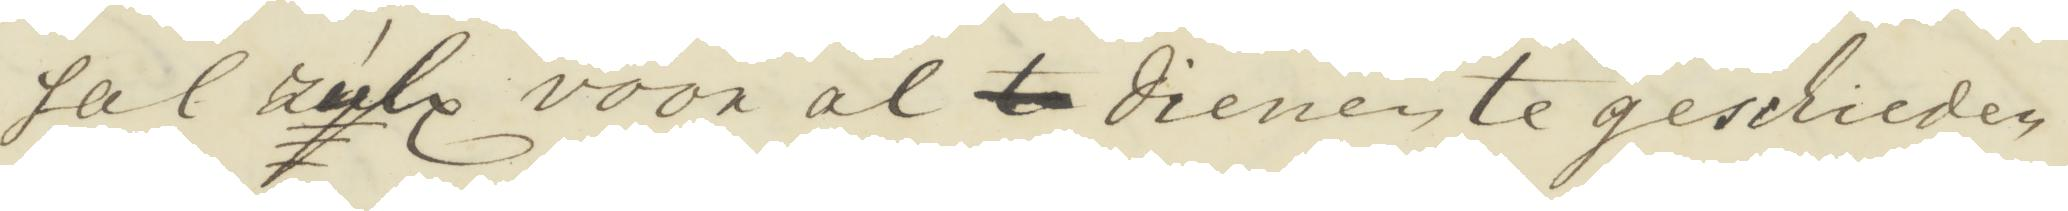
sal zulx voor al te dienen te geschieden
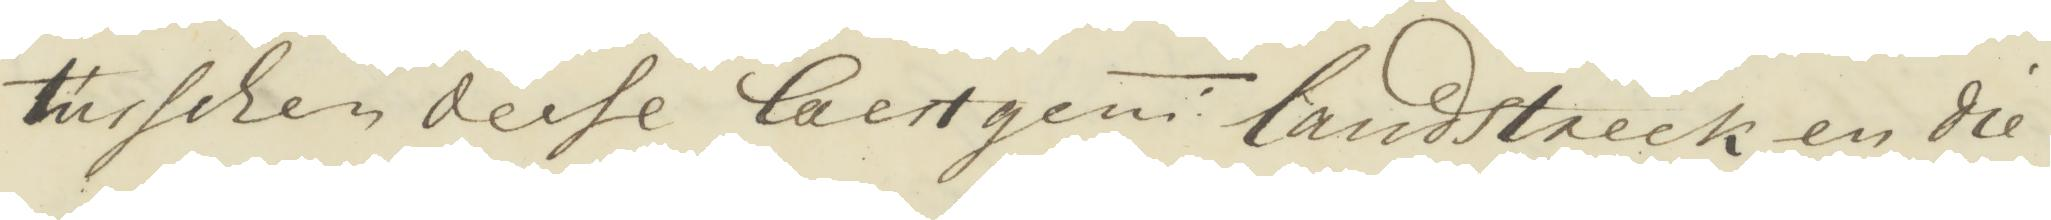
tusschen deese laestgem: landstreek en die
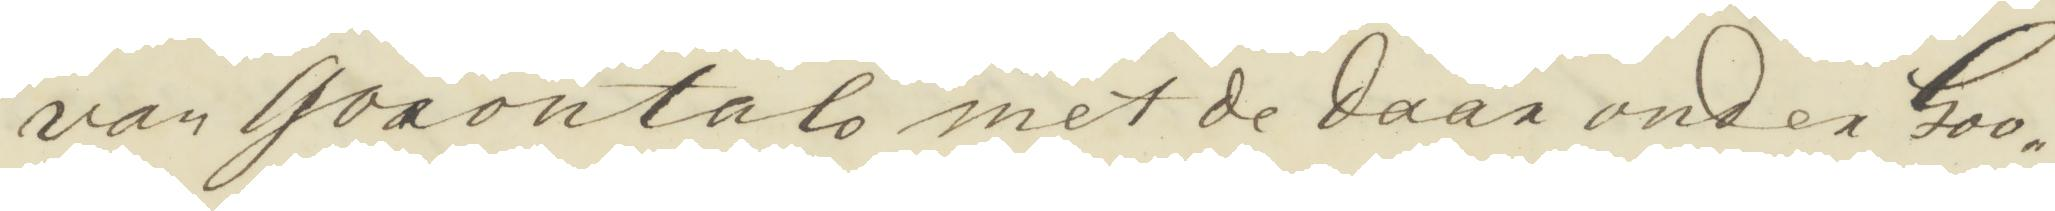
van Gorontalo met de daar onder hoo„
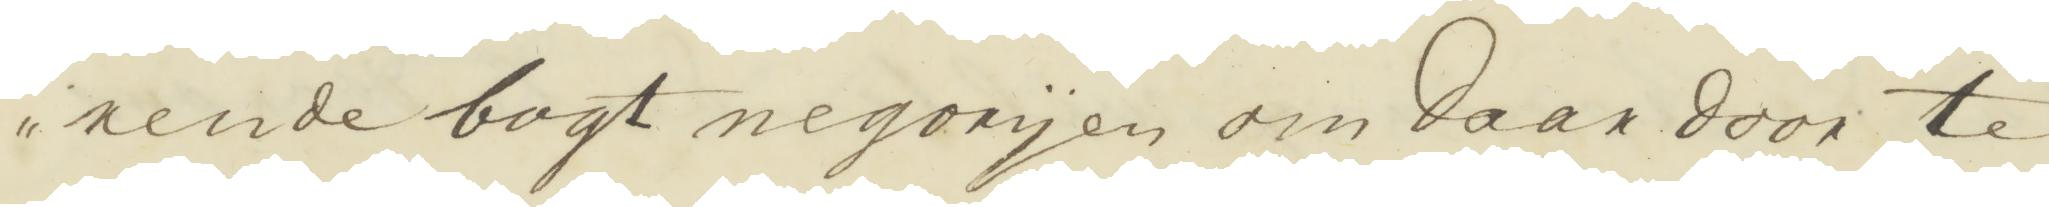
„rende bogt negorijen om daar door te
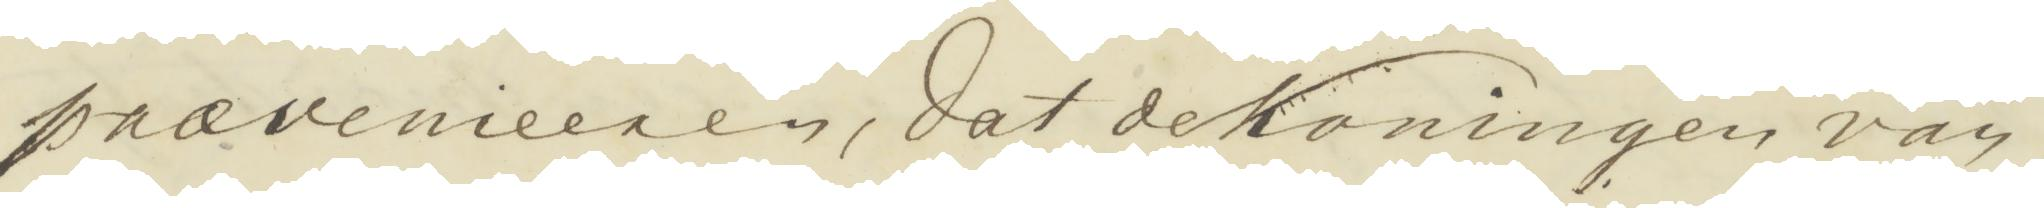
provenieeren, dat de koningen van
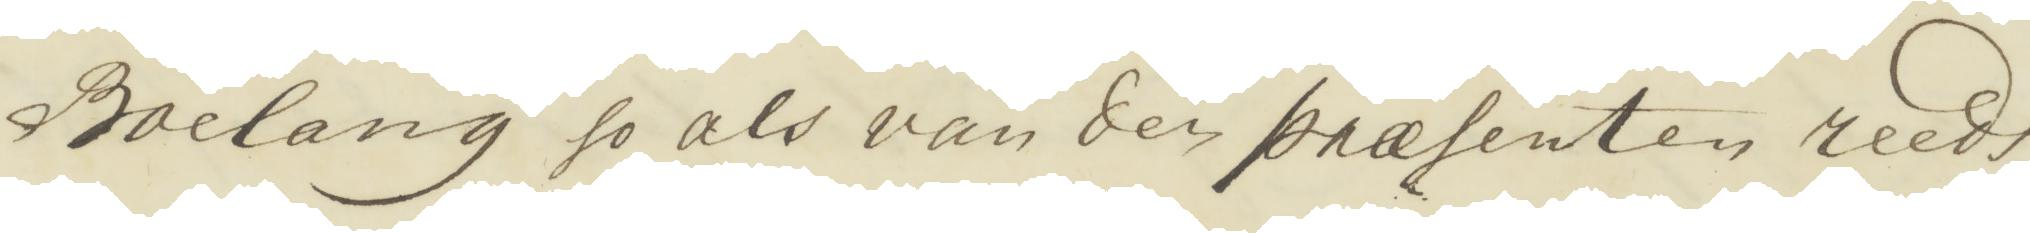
Boelang so als van den presenten reeds
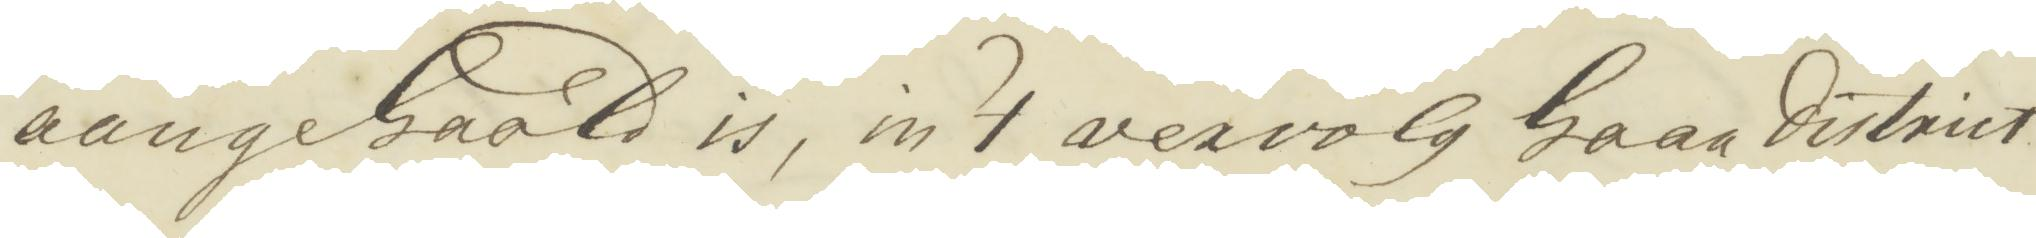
aangebaald is, in ’t vervolg haar district
